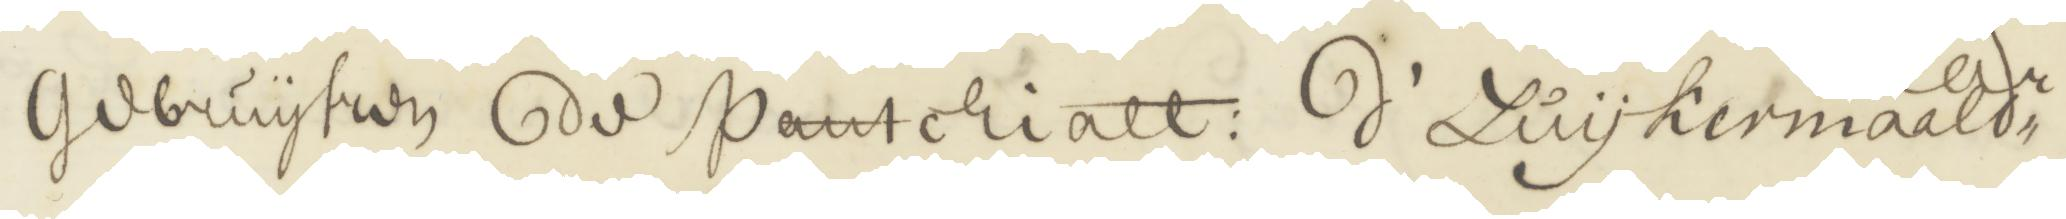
gebruijken de Pantchiall: d’ Zuijkermaald„r
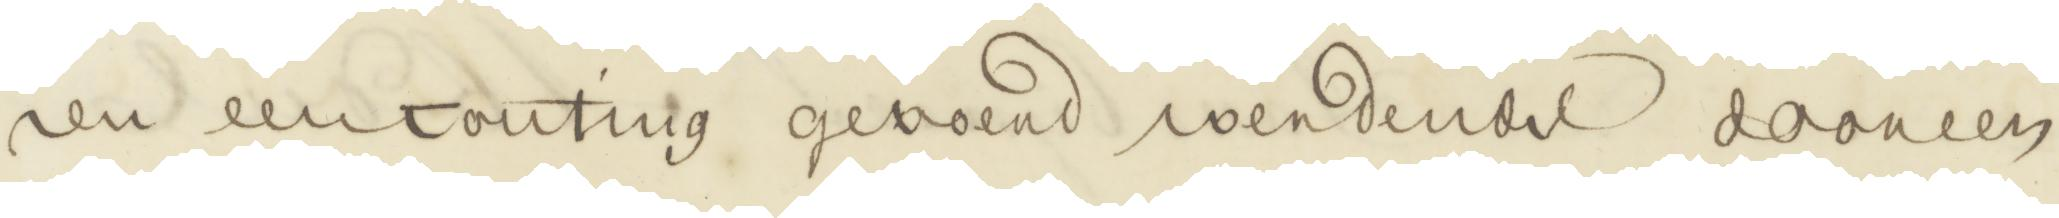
en een conting gevoerd werdende door een
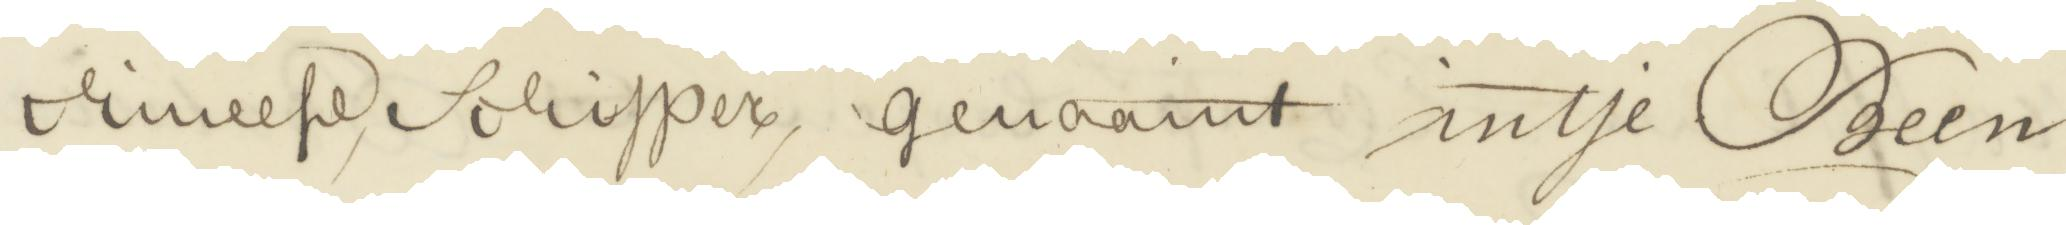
chineese schipper, genaamt intje Been
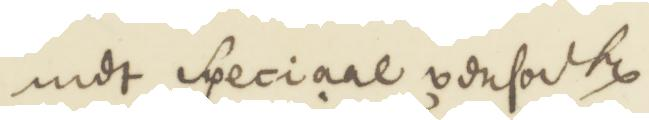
met Speciaal versoek
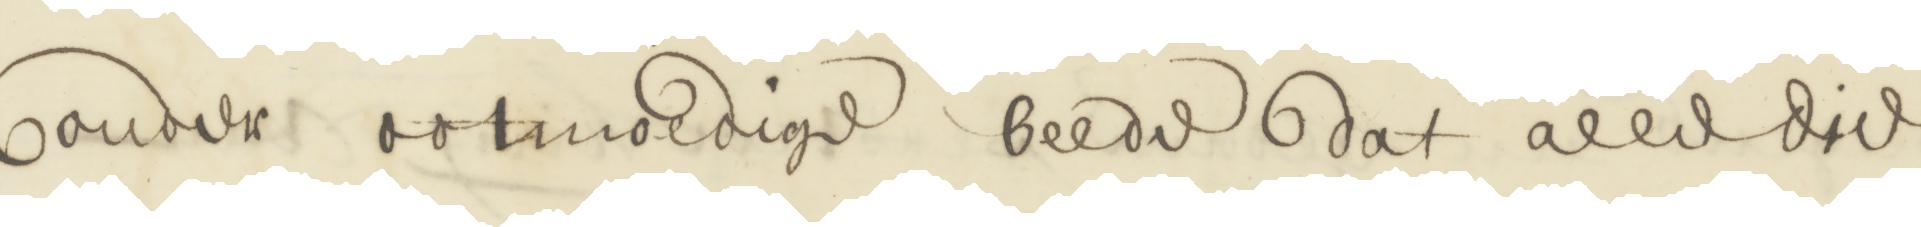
onder ootmoedige beede dat alle die
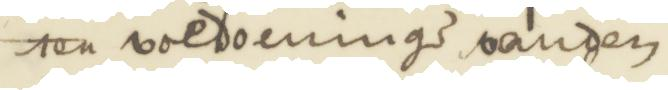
ter voldoeninge vanden
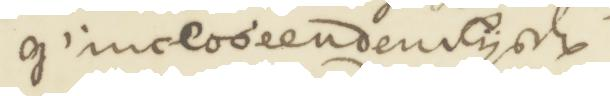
g’incloseerden eijsch
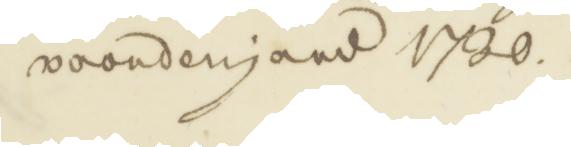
voordenjare 1770. –
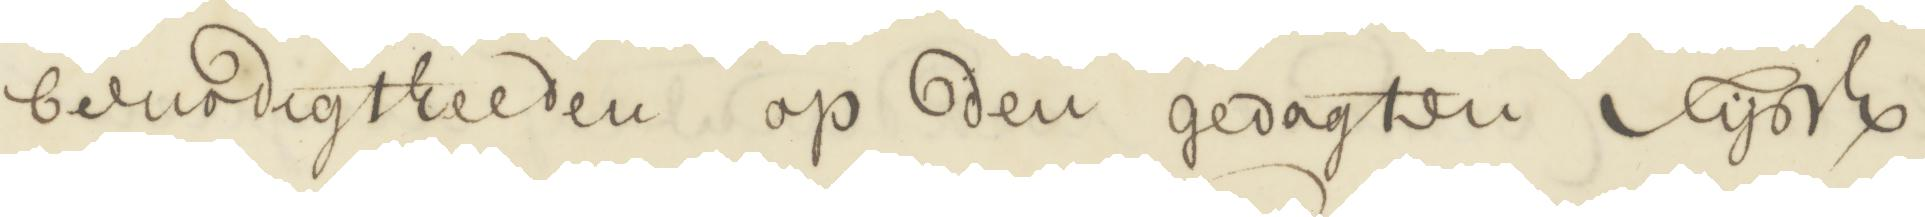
benodigtheeden op den gedagten Eijsch
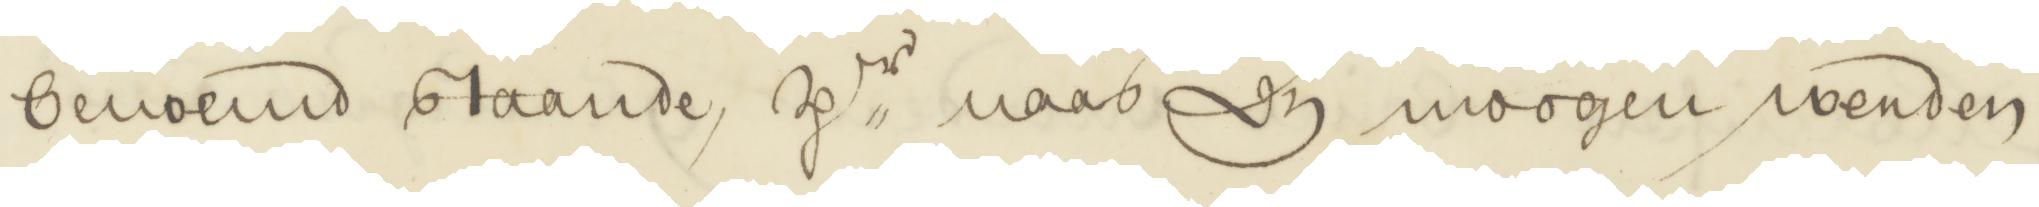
benoemd staande, p„r naasten moogen werden
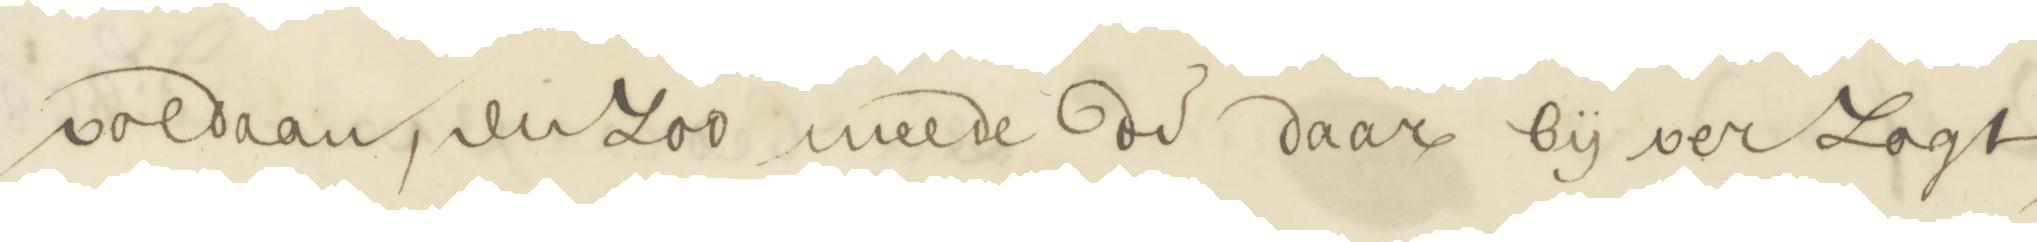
voldaan, en zoo meede de daar bij verzogt
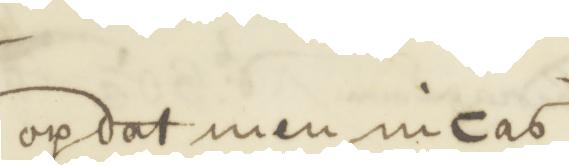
op dat men in cas
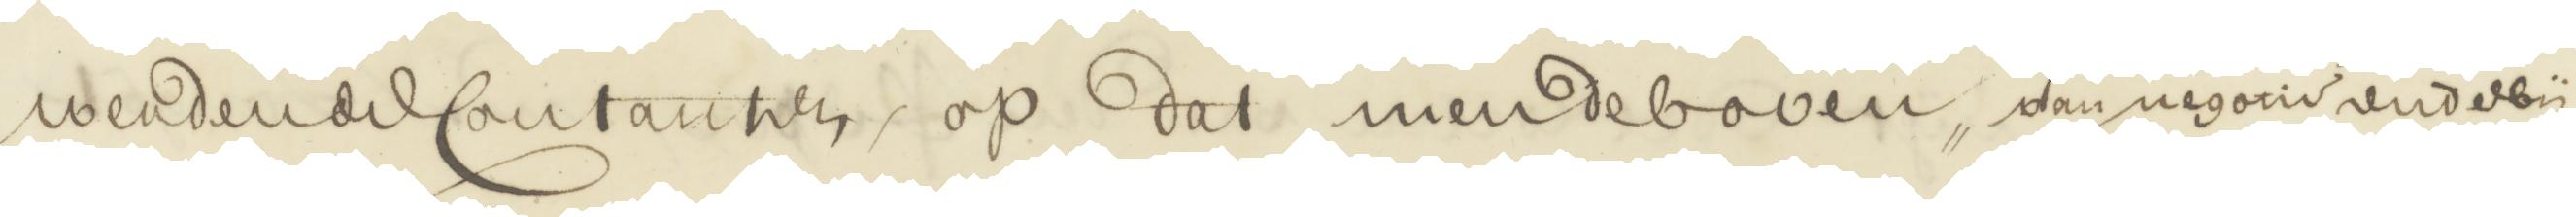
werdende contanten, op dat men de boven„ van negorie en de bij
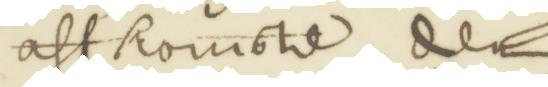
affkomste den
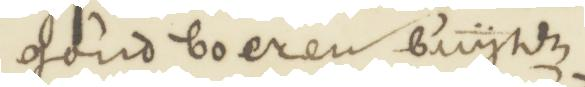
goud boeren buijten
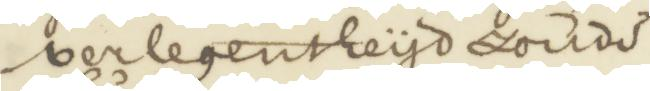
verlegentheijd zoude
